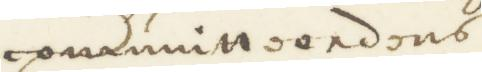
committeerdens
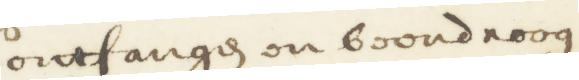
ontfangen en beendroog
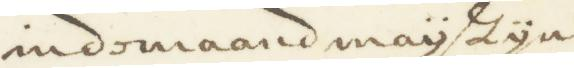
in de maand maij zijn
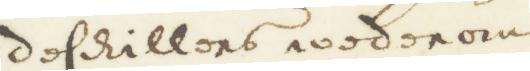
de schillers wederom
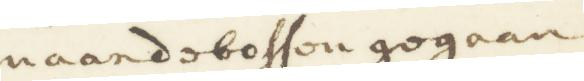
naar de bossen gegaan
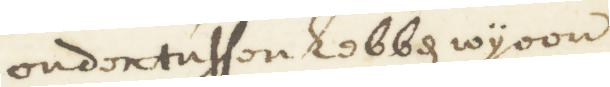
ondertussen hebben wij een
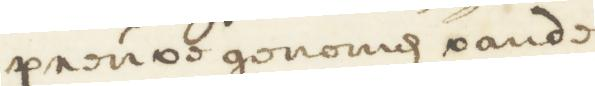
preuve genomen vande
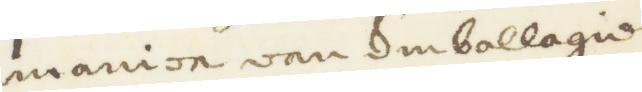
manier van Emballagie
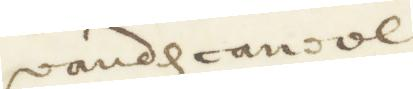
vanden caneel
